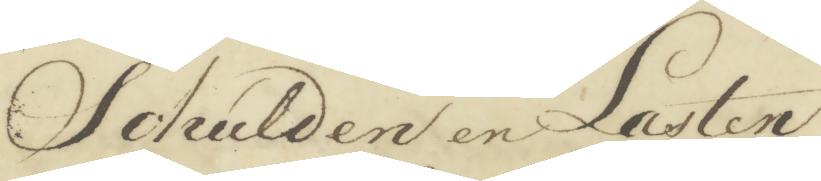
Schulden en Lasten
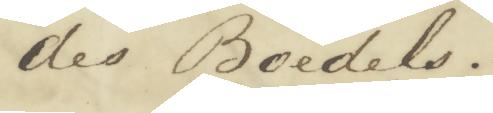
des Boedels.
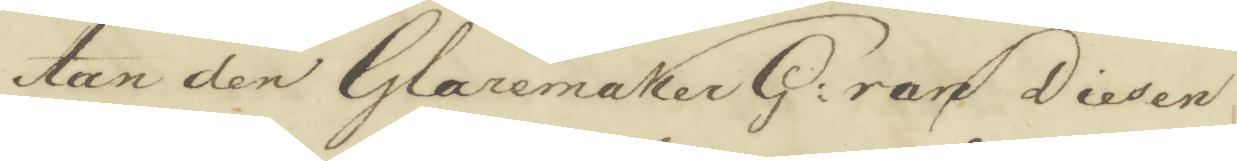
Aan den Glazemaker G: van Diesen
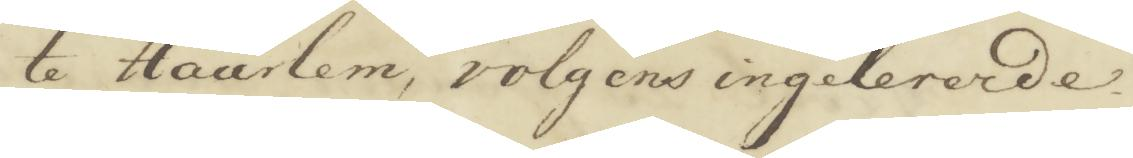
te Haarlem, volgens ingeleverde
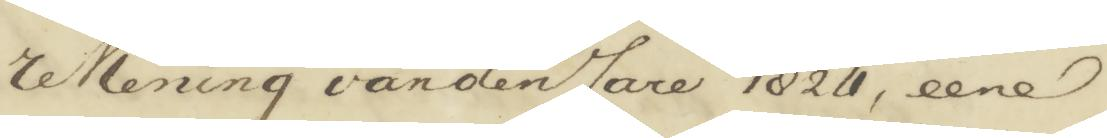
rekening van den Jare 1824, eene
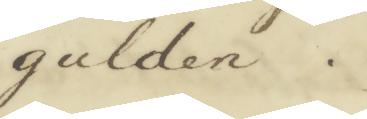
gulden . . . . . . . . . . . ƒ 1„ —
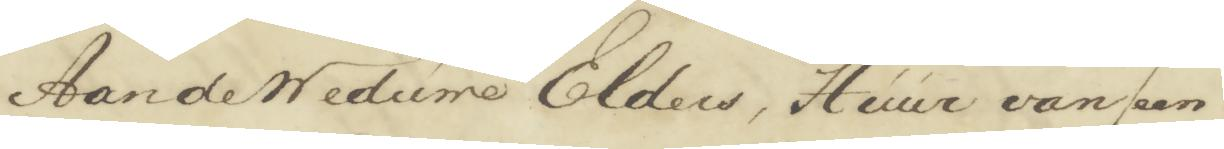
Aan de Weduwe Elders, Huur van een
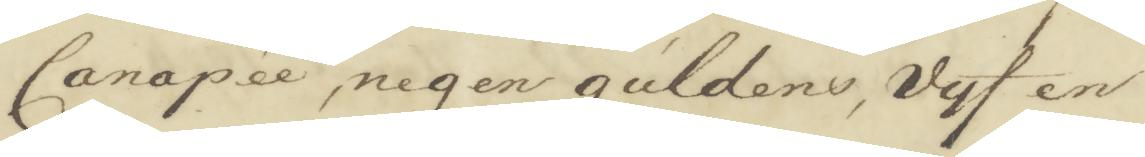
Canapée, negen guldens, vyf en
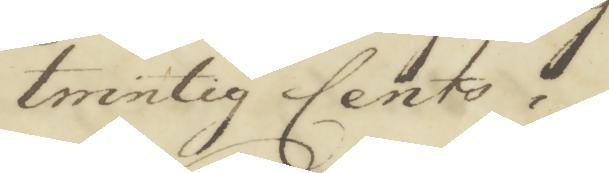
twintig Cents . . . . . . . . . . „ 9. 25.
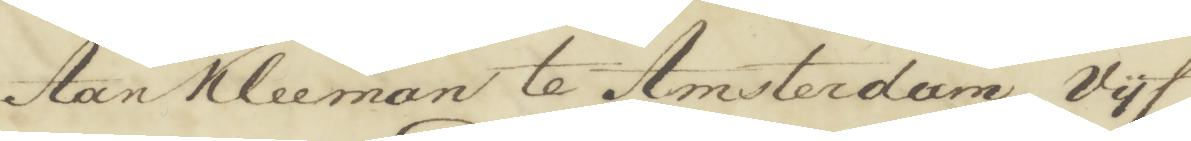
Aan Kleeman te Amsterdam, vijf
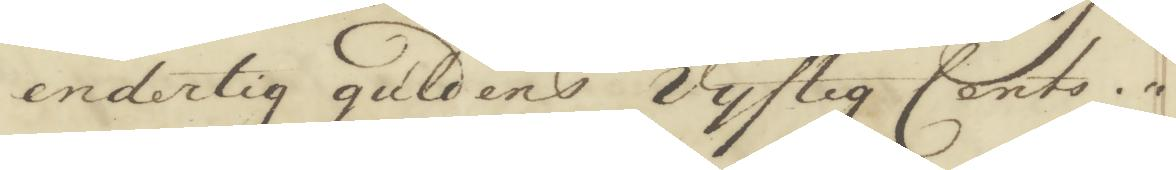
en dertig guldens vyftig Cents. „ 35 „ 50.
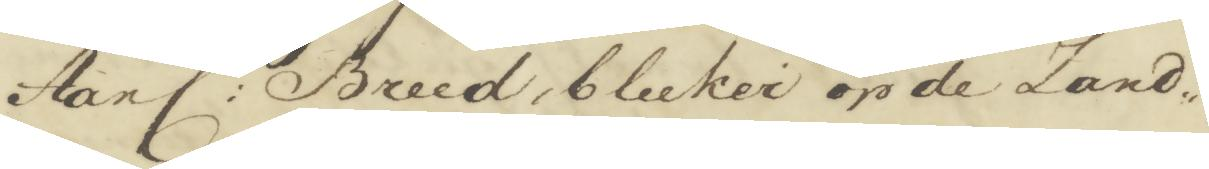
Aan C: Breed, bleeker op de Zand„
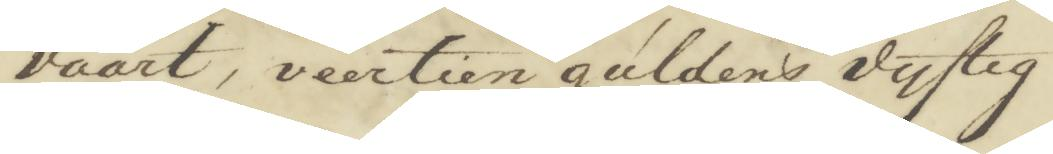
vaart, veertien guldens vyftig
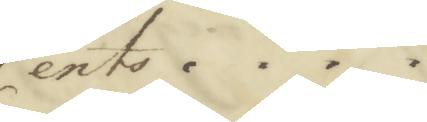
Cents . . . . . . . . . . . . . „ 14. 50.
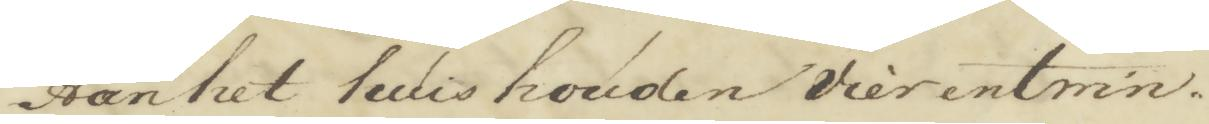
Aan het huishouden vier entwin„
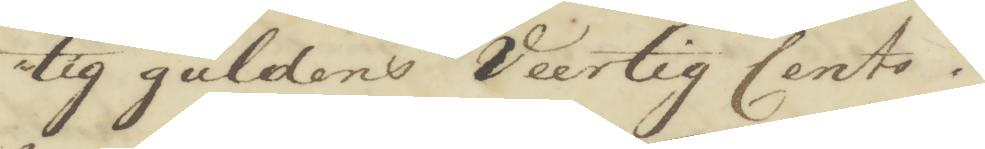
„tig guldens Veertig Cents . . . . „ 24. 40.
